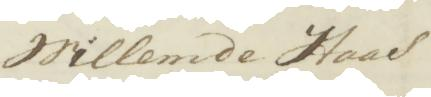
Willem de Haas
